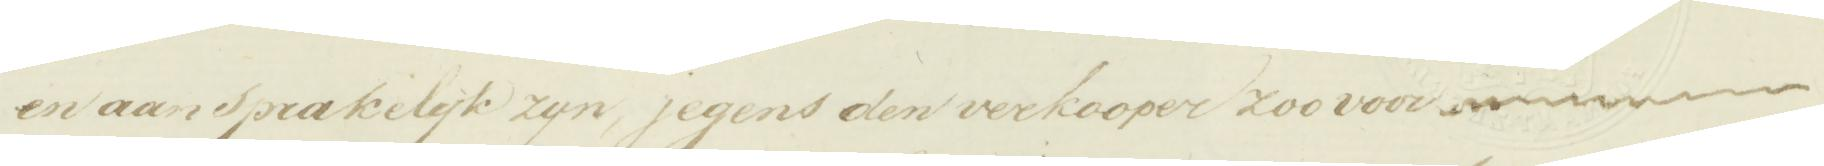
en aansprakelijk zyn, jegens den verkooper zoo voor
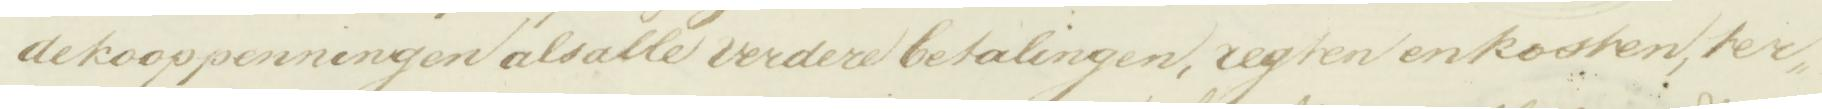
de kooppenningen als alle verdere betalingen, regten en kosten, ter„
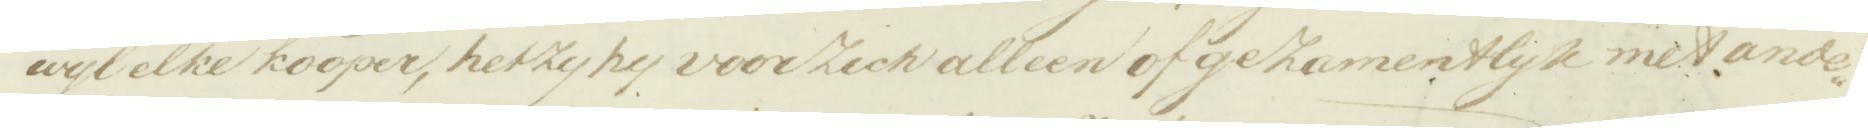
wyl elke kooper, hetzy hy voor zich alleen of gezamentlijk met ande„
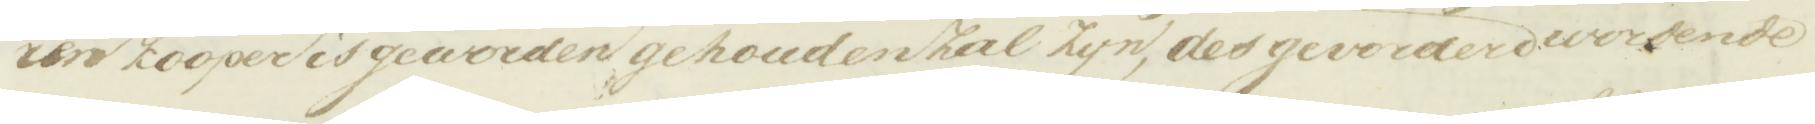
ren kooper is geworden gehouden zal zijn, des gevorderd wordende
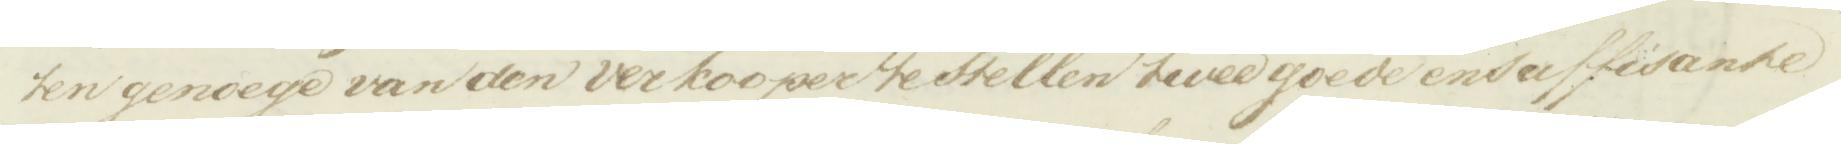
ten genoege van den verkooper te stellen twee goede en suffisante
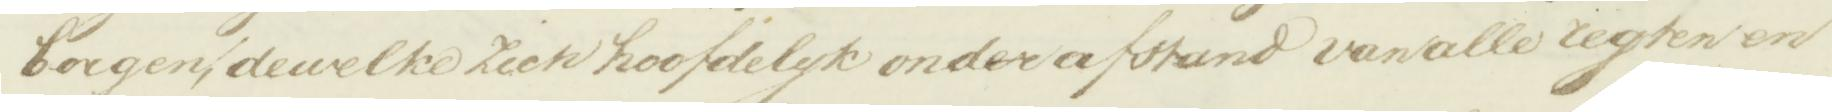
borgen, dewelke zich hoofdelyk onder afstand van alle regten en
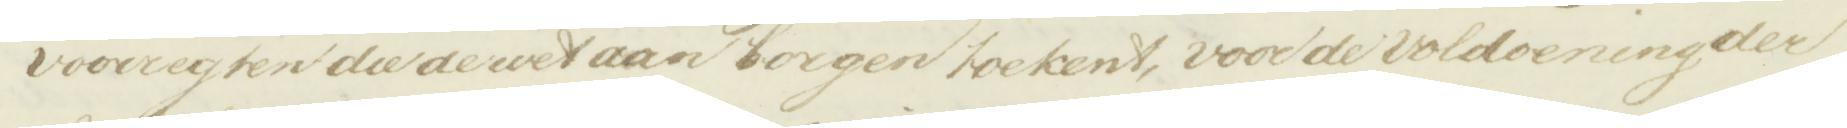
voorregten die de wet aan borgen toekent, voor de voldoening der
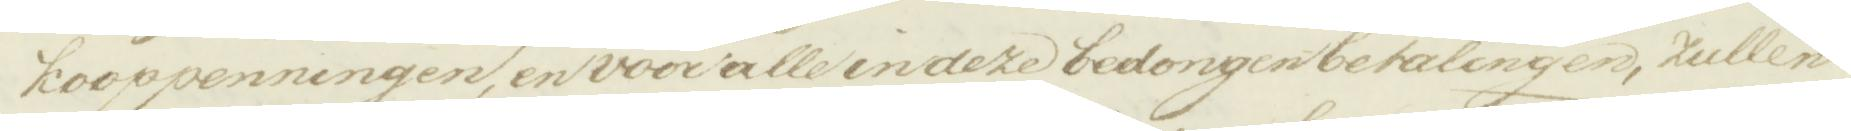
kooppenningen, en voor alle in deze bedongen betalingen, zullen
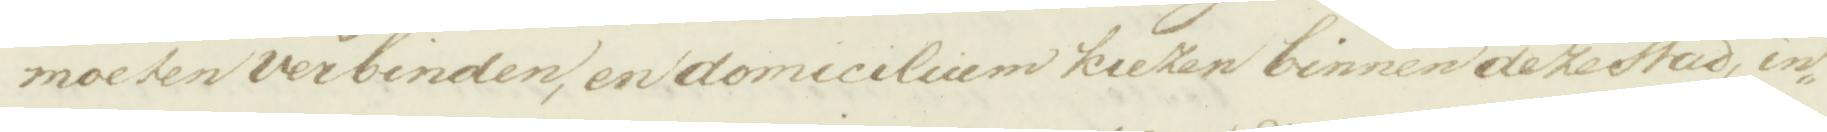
moeten verbinden, en domicilium kiezen binnen deze stad, in„
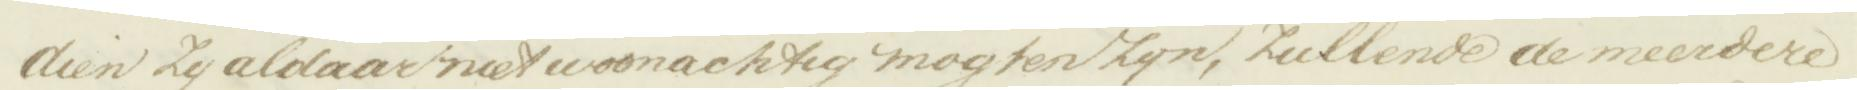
dien zy aldaar niet woonachtig mogten zijn, zullende de meerdere
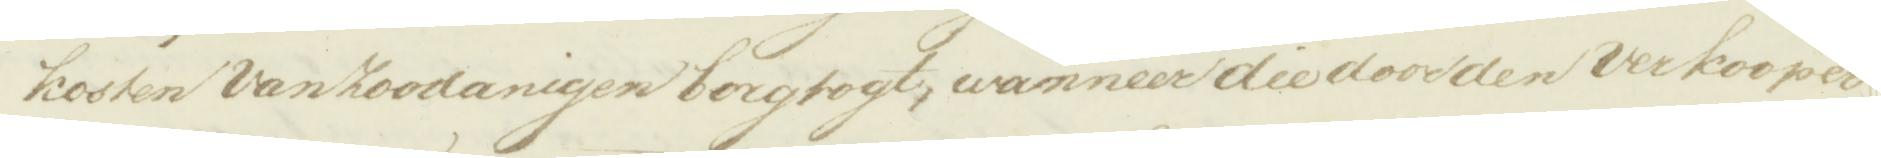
kosten van zoodanigen borgtogt, wanneer die door den verkooper
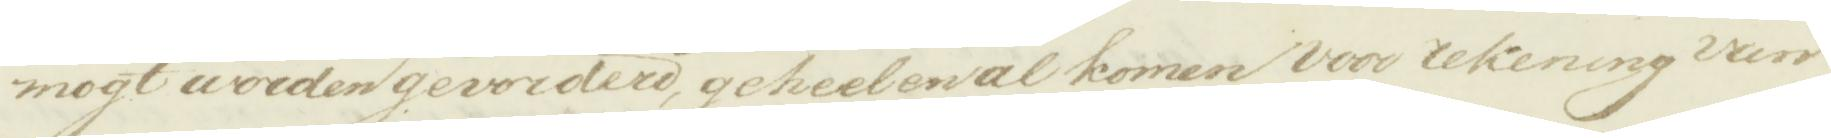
mogt worden gevorderd, geheel en al komen voor rekening van
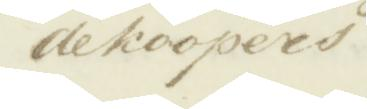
de koopers
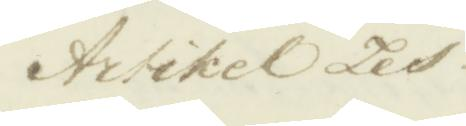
Artikel Zes
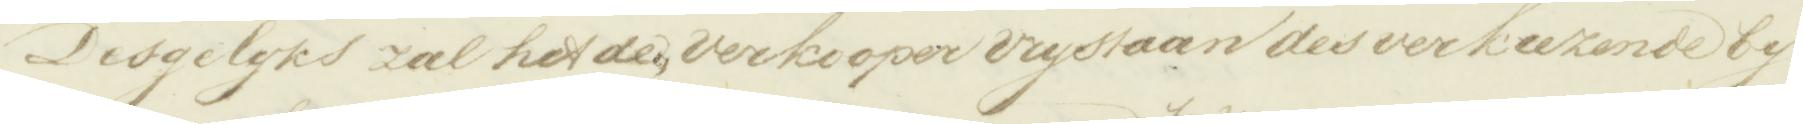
Desgelyks zal het den verkooper vrystaan des verkiezende by
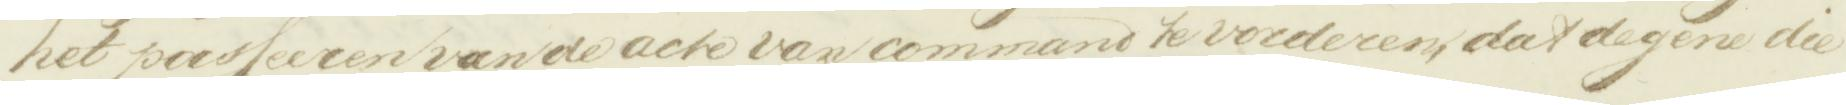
het passeeren van de acte van command te vorderen, dat degene die
